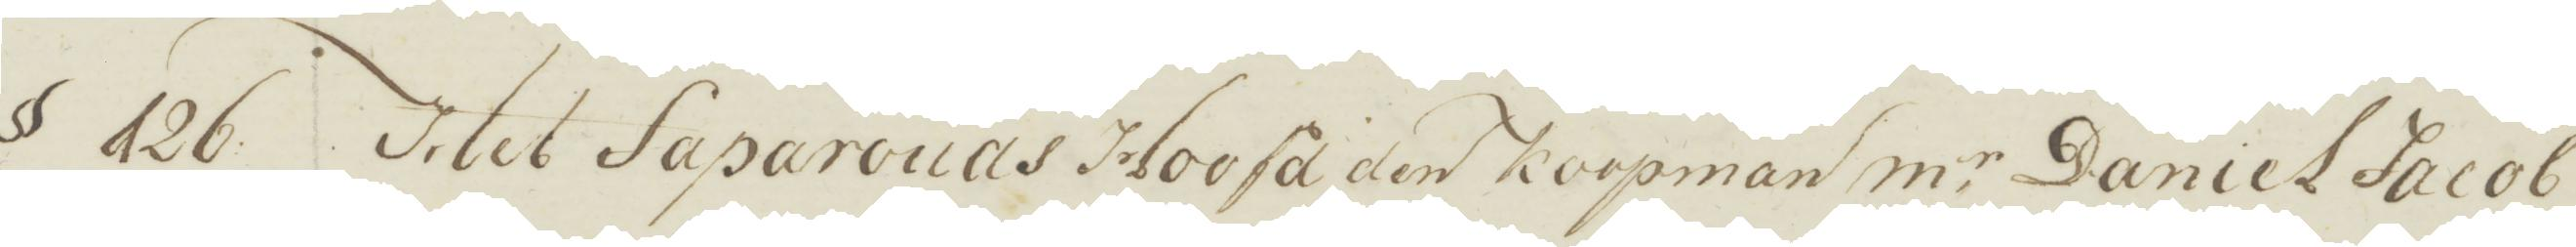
§ 426: Het Saparouas Hoofd den Koopman m:r Daniel Iacob
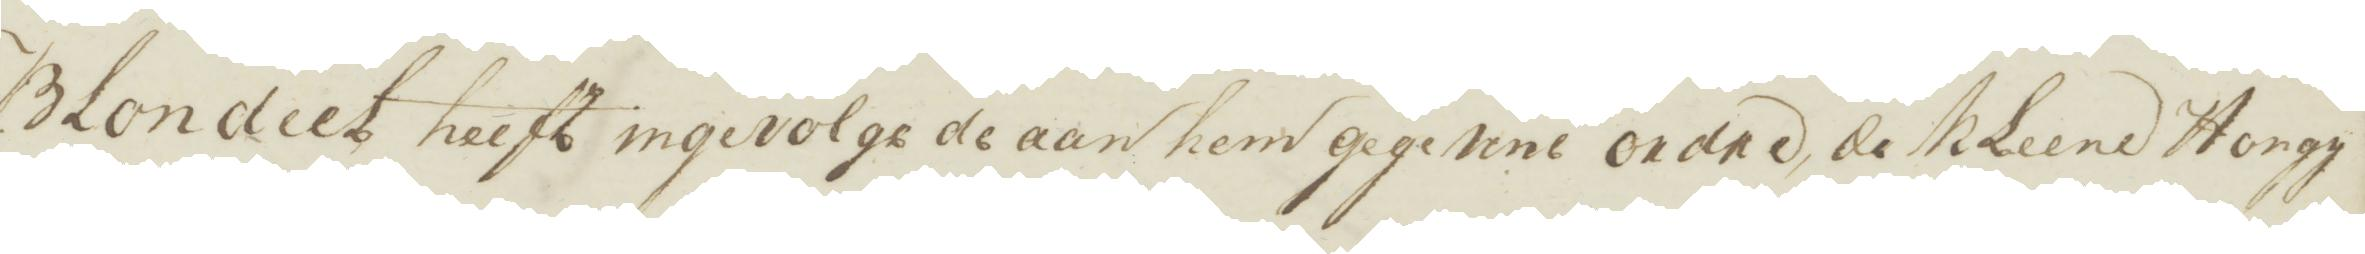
Blondeel heeft ingevolge de aan hem gegevene ordre, de kleene Hongij
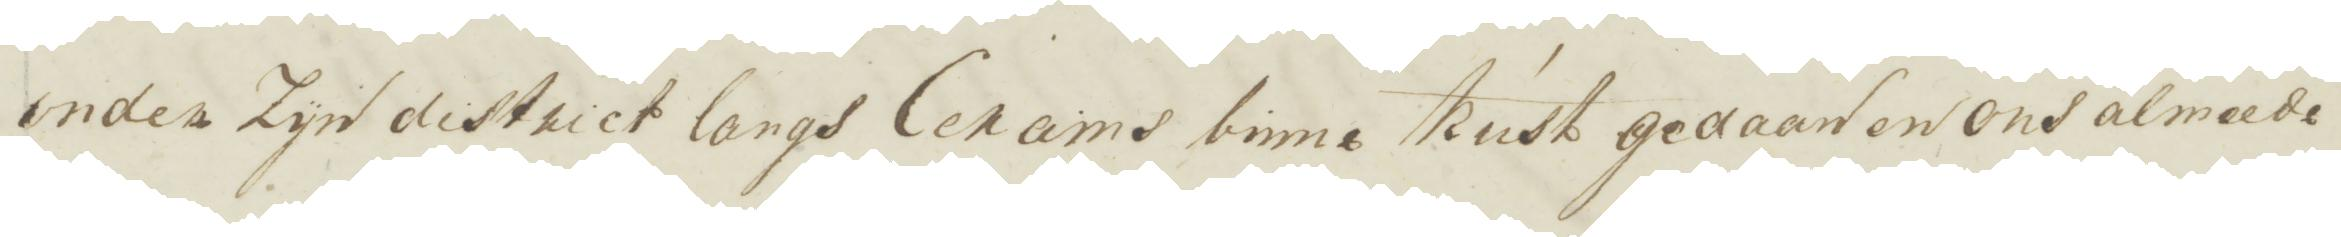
onder zijn district langs Cerams binne kust gedaan en ons almeede
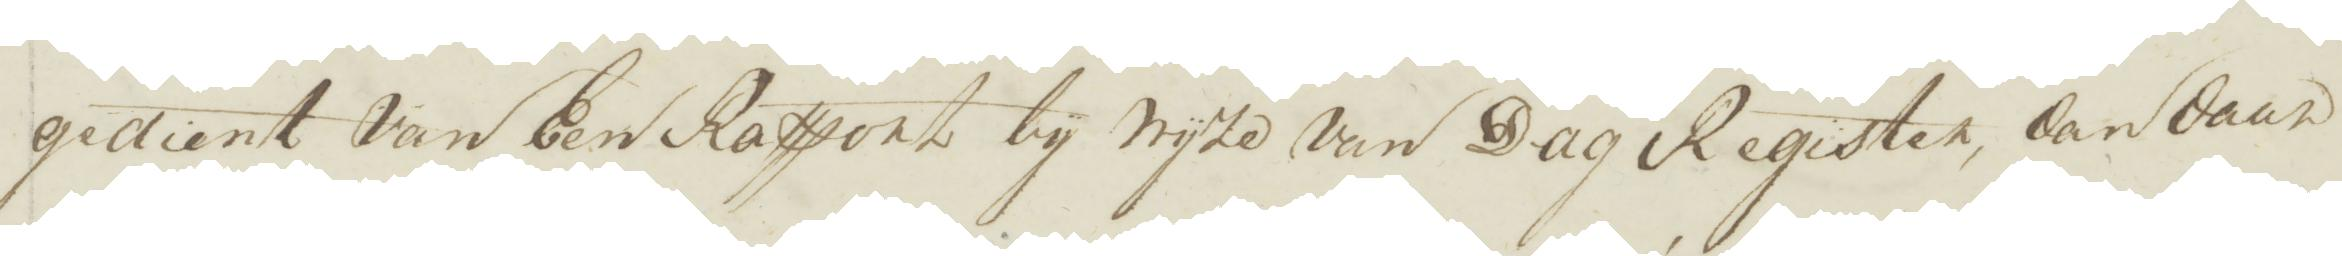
gedient van Een Rapport bij wijze van Dag Register, dan daar
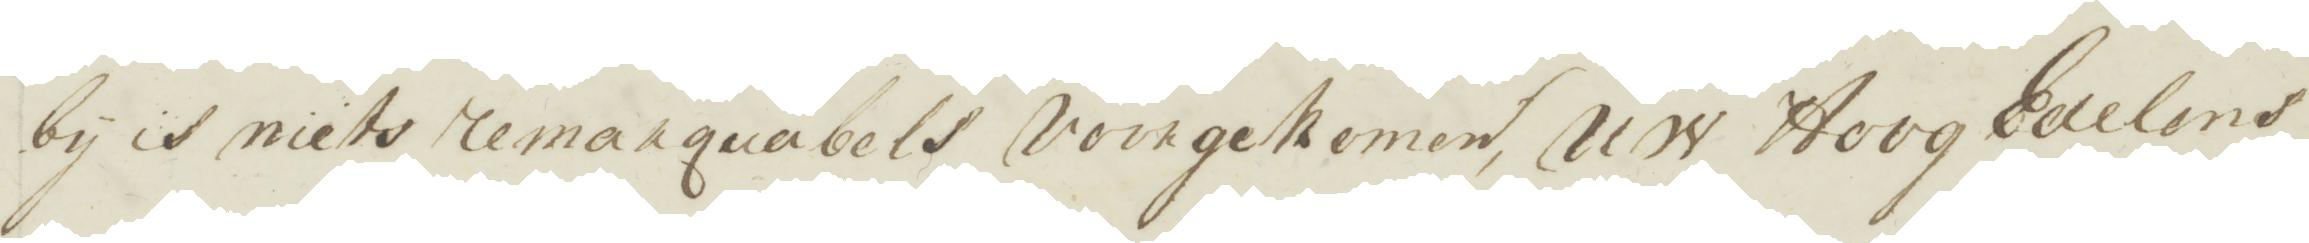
bij is niets remarquabels voorgekomen, Uw Hoog Edelens
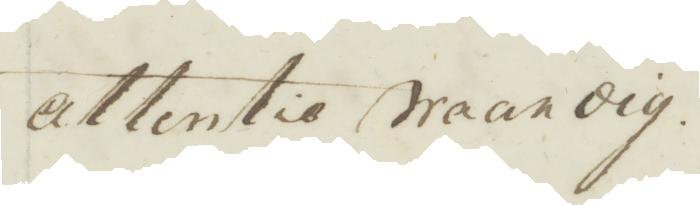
attentie waardig.
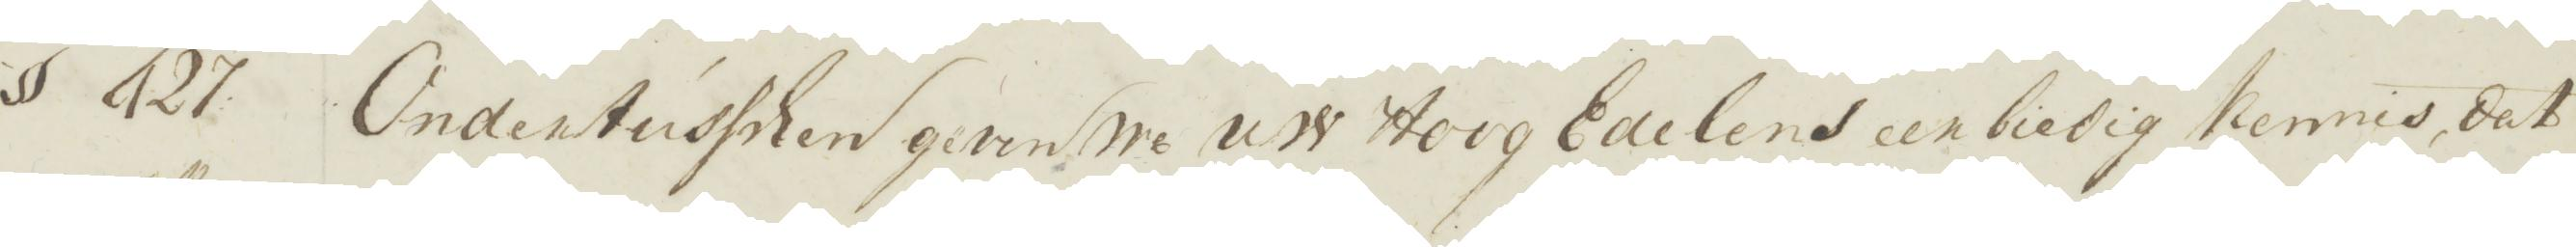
§ 427: Ondertusschen geven we uw Hoog Edelens eer biedig kennis, dat
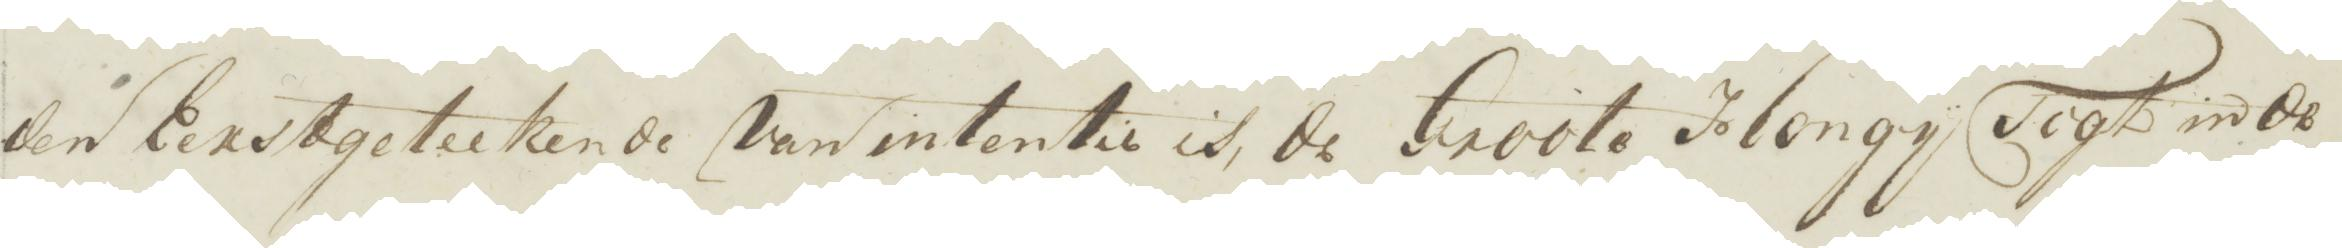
den Eerstgeteekende van intentie is, de Groote Hongij Togt in de
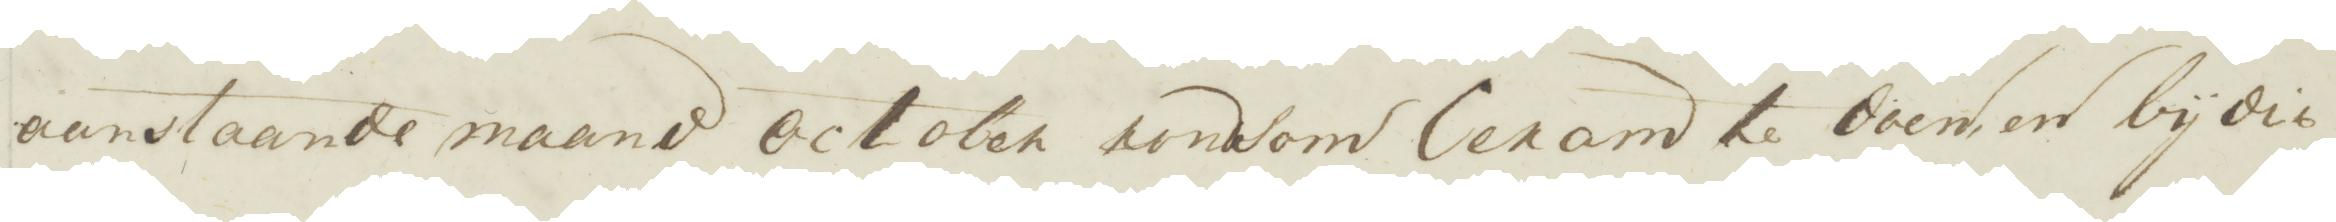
aanstaande maand october rondsom Ceram te doen, en bij die
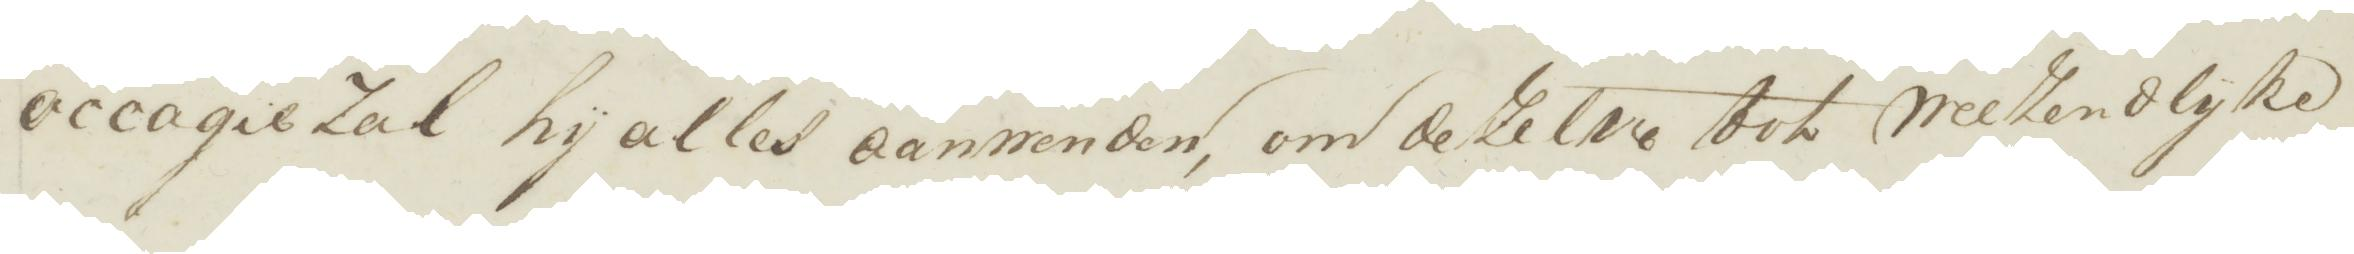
occagie zal hij alles aanwenden, om dezelve tot weezendlijke
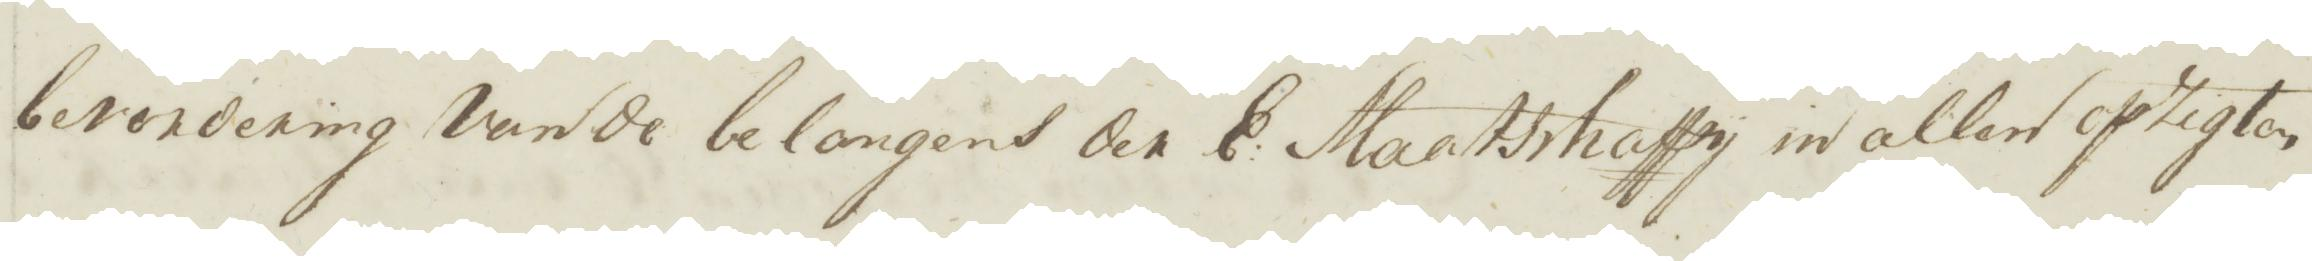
bevordering van de belangens der E: Maatschappij in allen opzigten
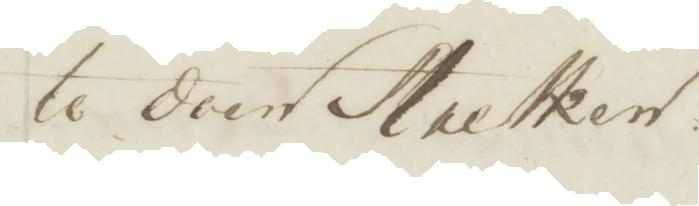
te doen strekken
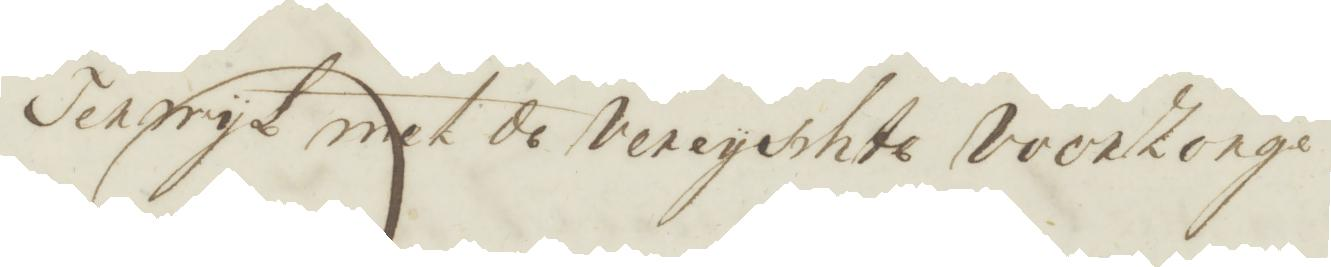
Terwijl met de vereijschte voorzorge
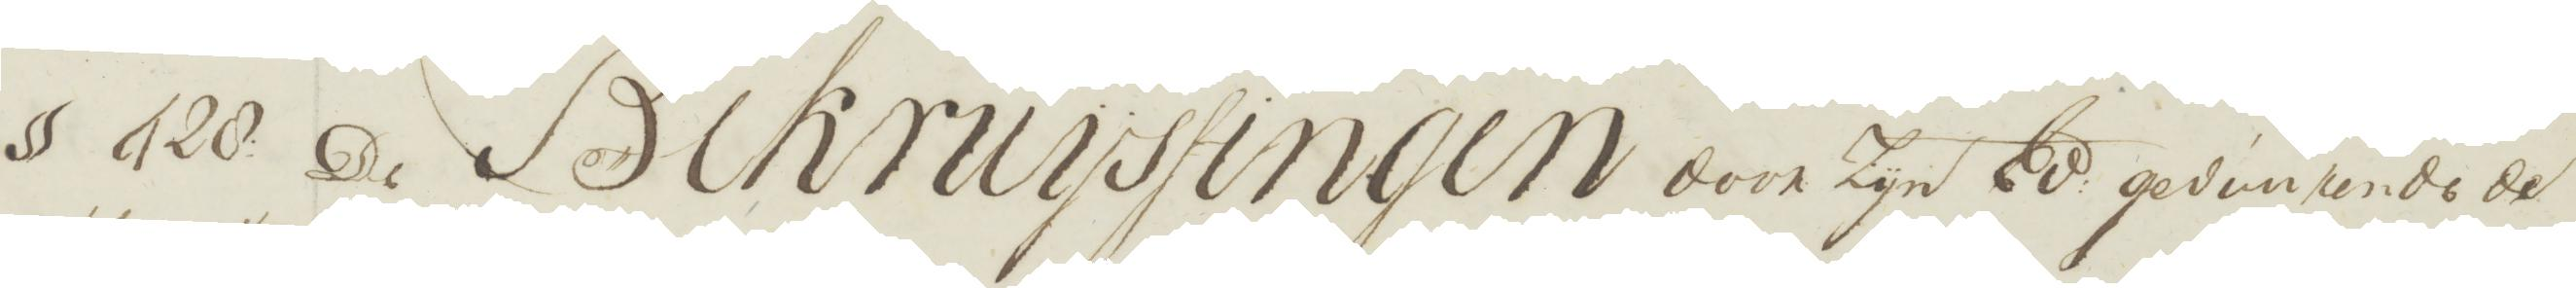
§ 428: De Bekruijssingen door zijn Ed: geduurende de
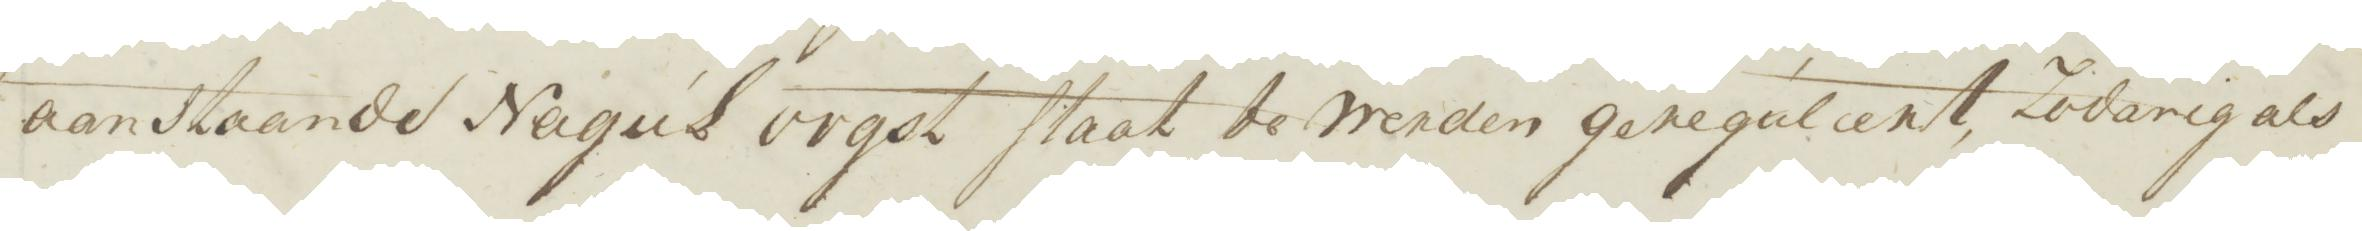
aanstaande Nagul oogst staat te werden gereguleert, zodanig als
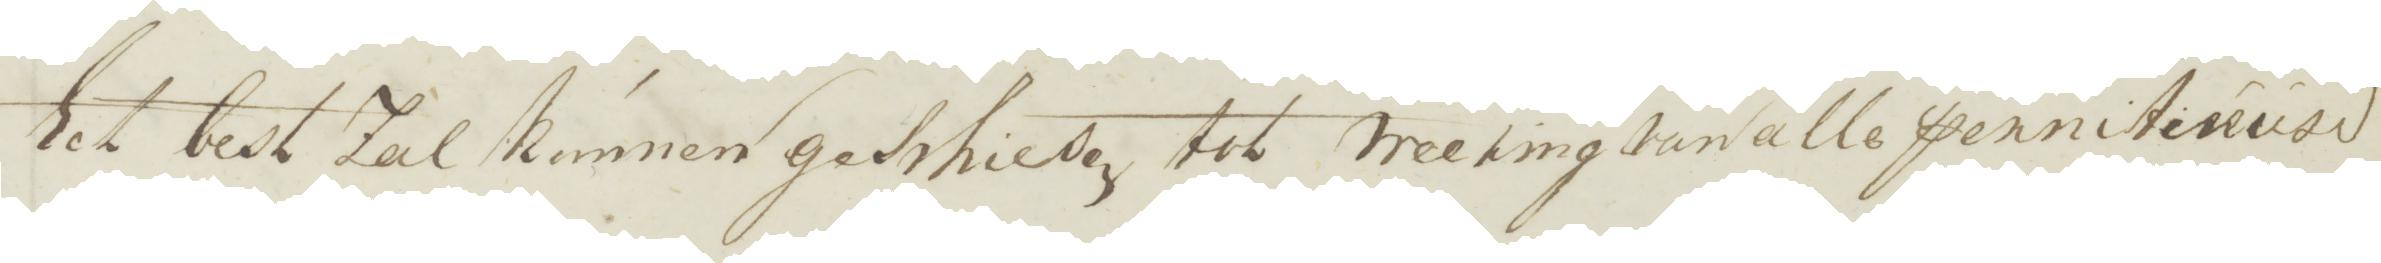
het best zal kunnen geschieden tot weering van alle pernitieeuse
